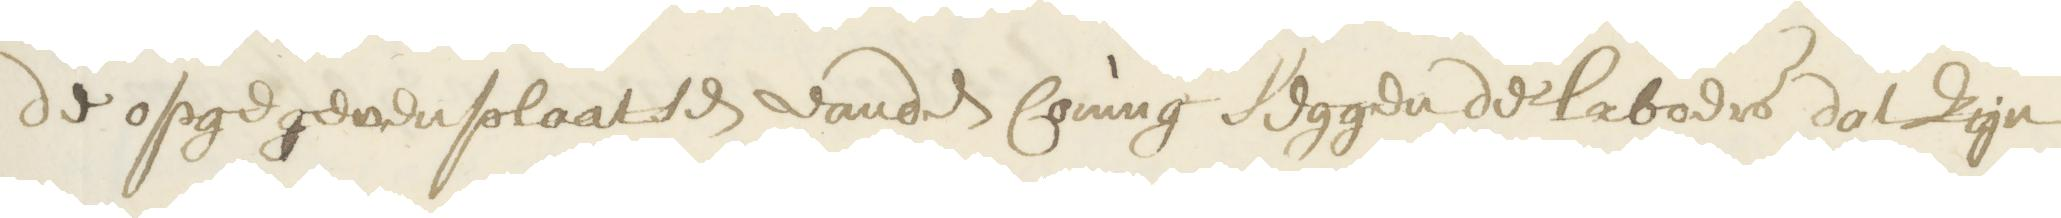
de opgegeven plaatsen van den Coning seggen de laboers dat zijn
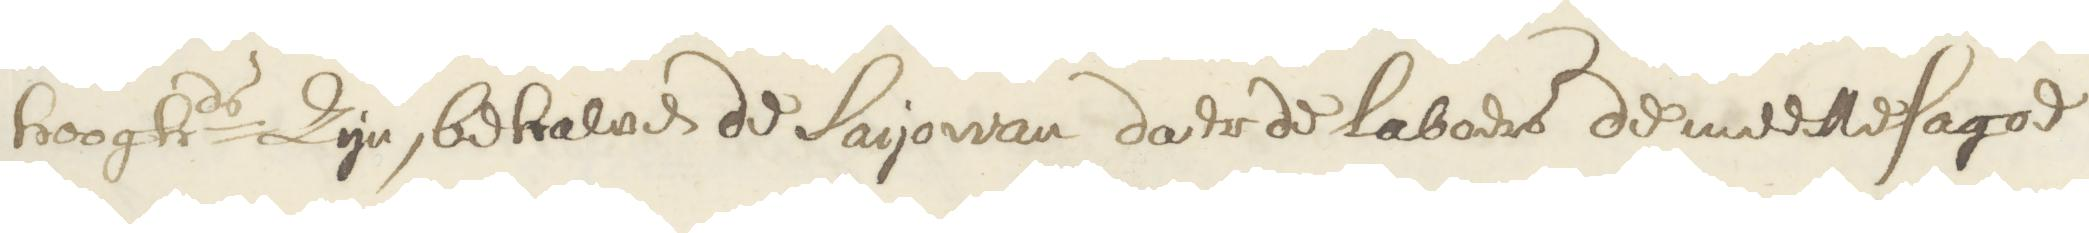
hoogh=ds zijn, behalve de Sagowan daer de laboers de meeste sagoe
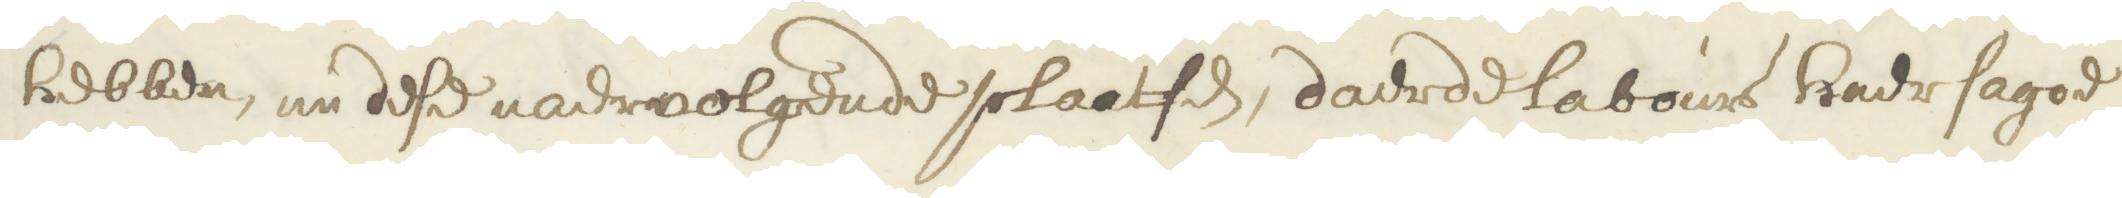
hebben, in dese naervolgende plaatsen, daerde labour haer sagoe
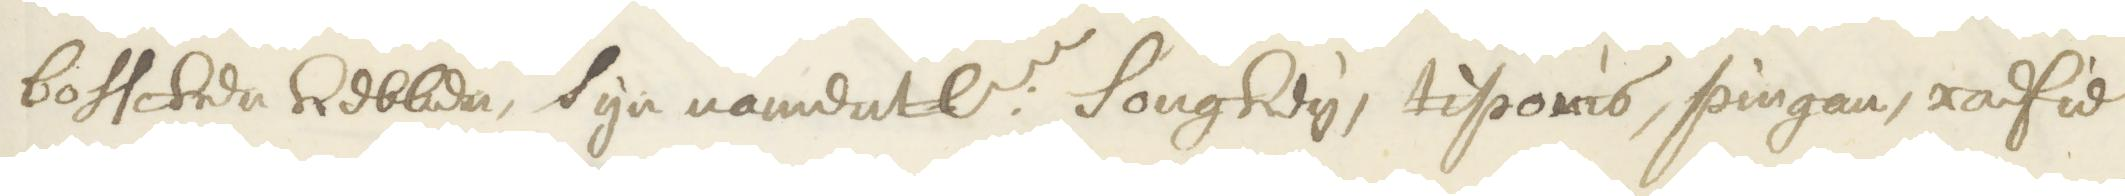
bosschen hebben, sijn namentl: songkeij, tiporis, pingan, raefie
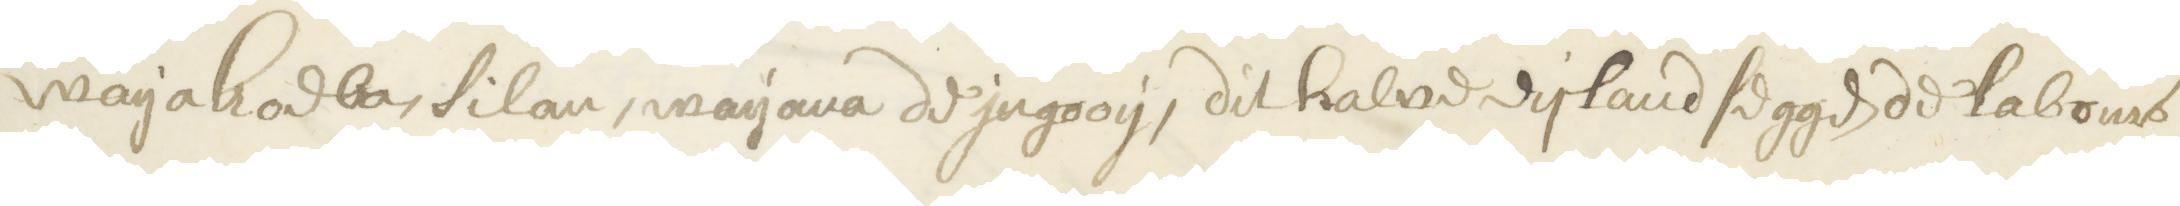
waijakoeba, silan, maijana de jngooij, dit halve eijland seggen de labours
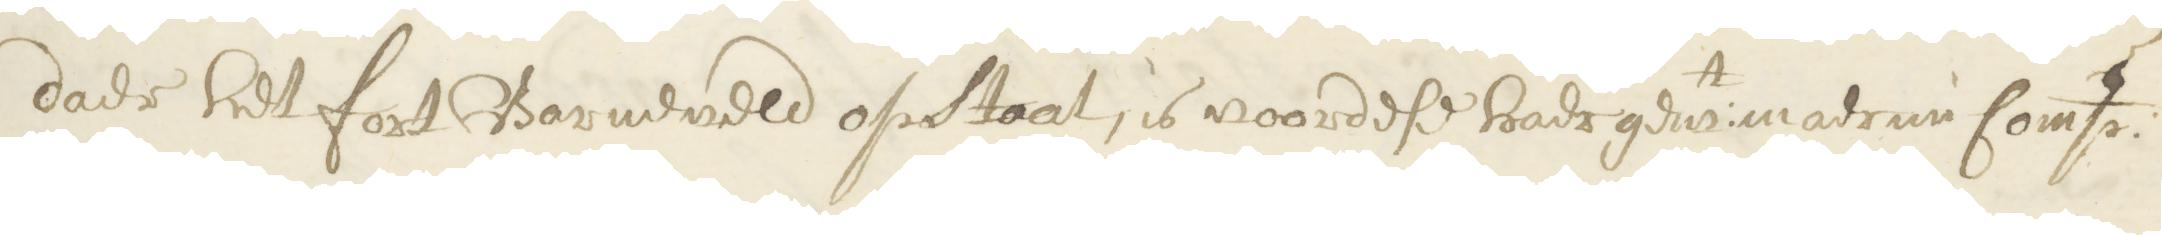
daer het fort Barneveld opstaat, is voor dese haer gew:t maer nu Comp:s
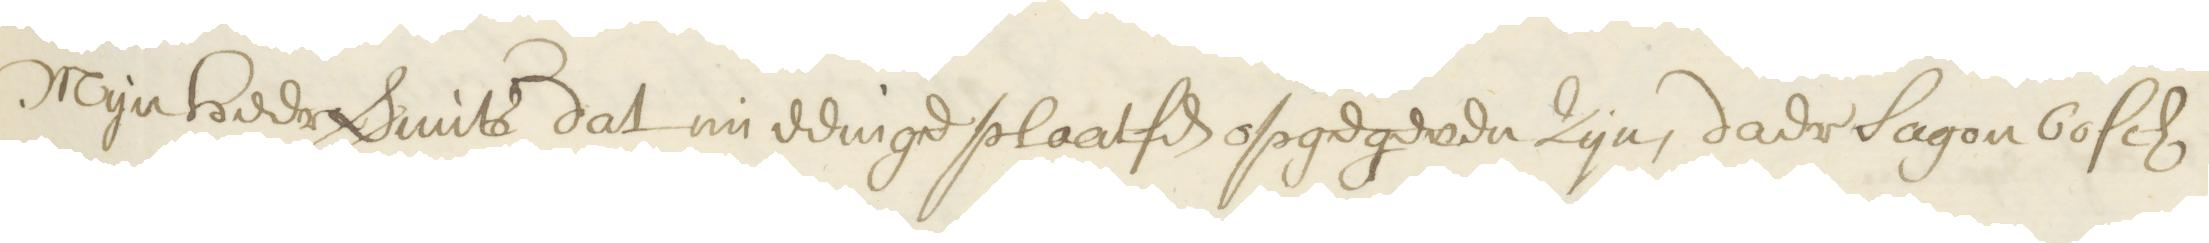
Mijn heer vermits dat nu eenige plaatsen opgegeven zijn, daer sagon bosch
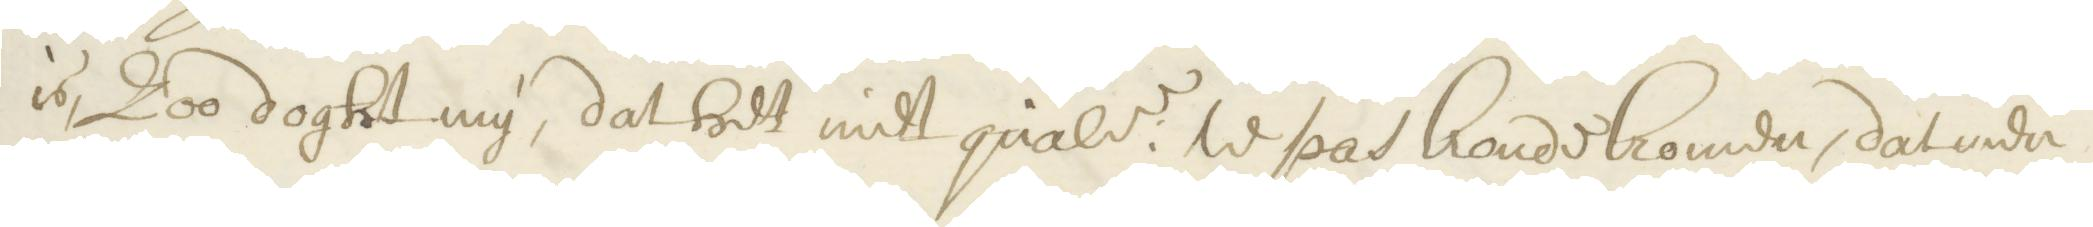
is, zoo doght mij, dat het niet qual:' te pas konde komen, dat men
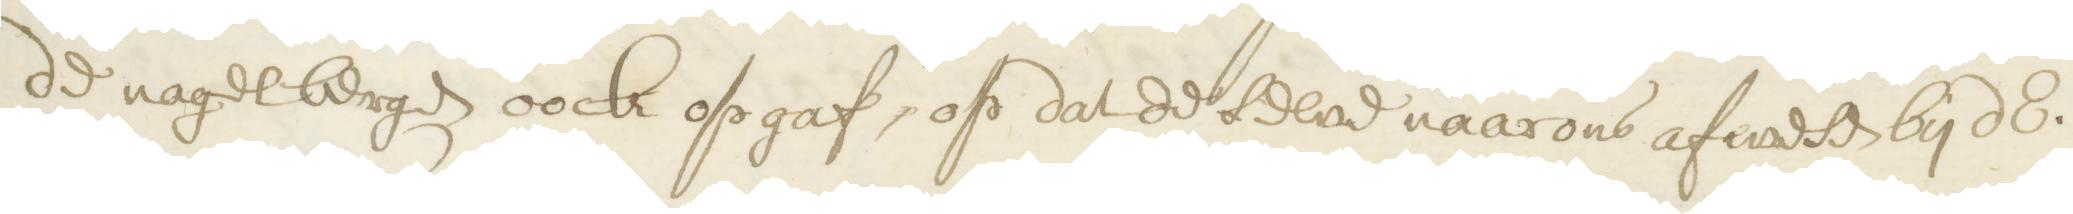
de nagelbergen oock opgaf, op dat de selve naar ons afwesen bij dE.
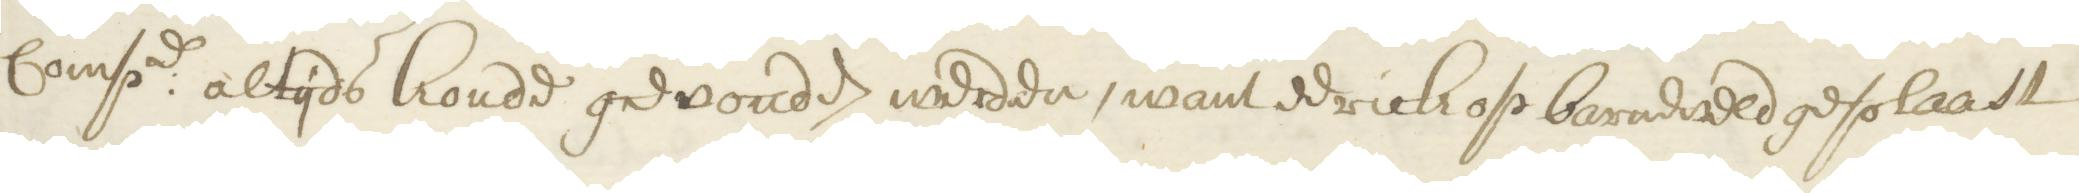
Comp:e altijds konde gevonden werden, want eer ick op barneveld geplaast
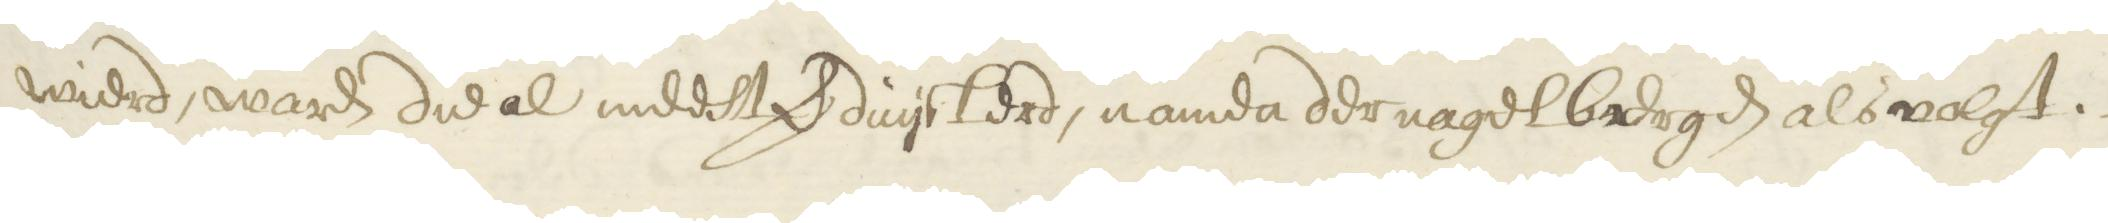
wierd, waren die al meest verduijsterd, namen der nagelbrergen als volgt.
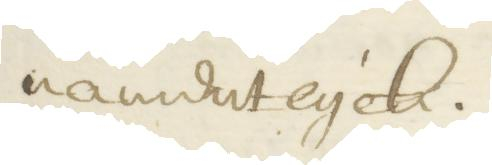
namentlijck.
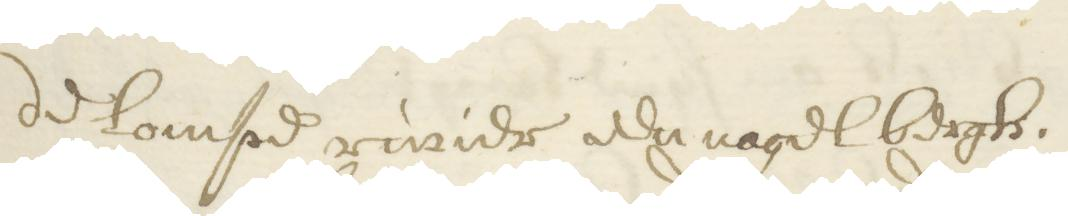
de lompe rivier een nagel bergh.
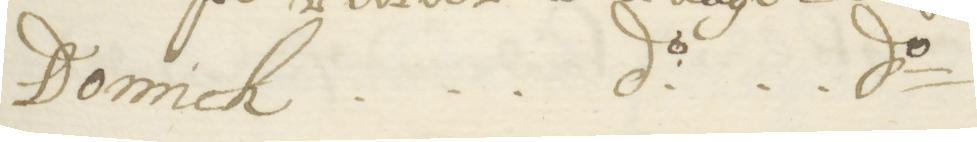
Domick . . . d:o . . d=o
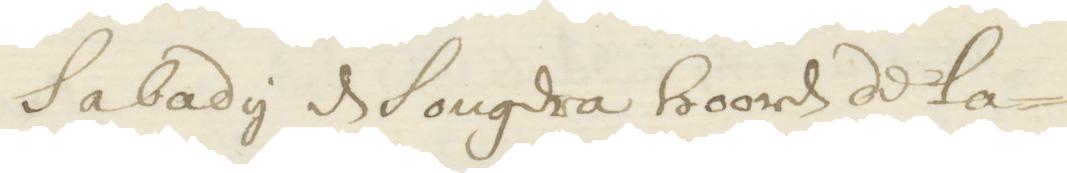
Sabadij en songera hooren de la=
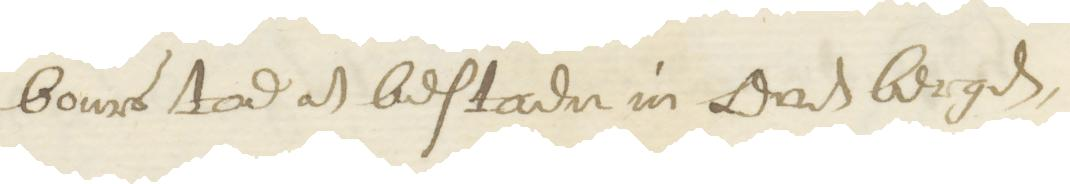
bour toe en bestaen in seven bergen,
